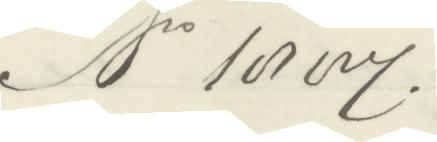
No 1887.
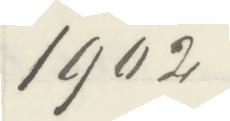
1902
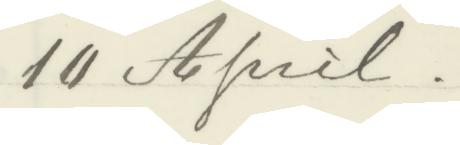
10 April.
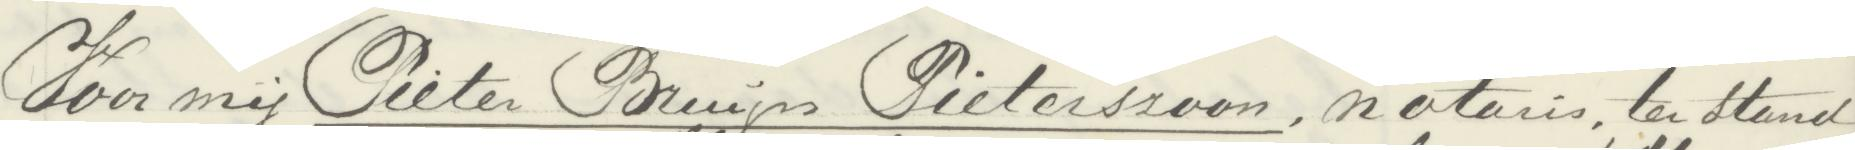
Voor mij Pieter Bruijn Pieterszoon, notaris, ter stand,
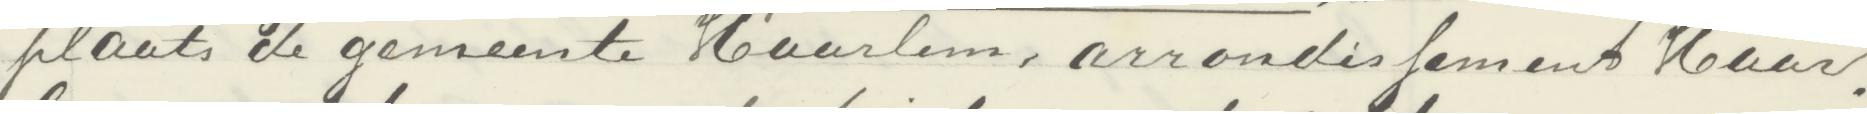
plaats de gemeente Haarlem, arrondissement Haar„
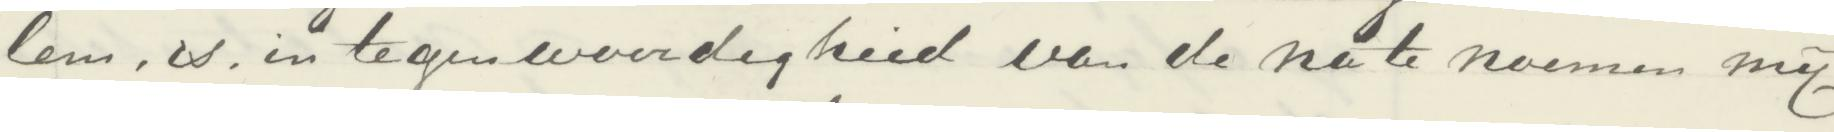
len, is, in tegenwoordigheid van de na te noemen mij
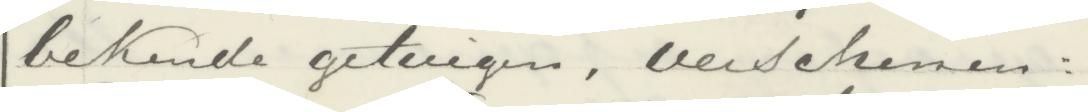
bekende getuigen, verschenen:
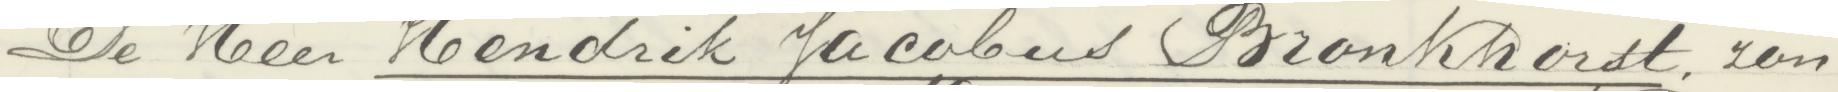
De Heer Hendrik Jacobus Bronkhorst, zon
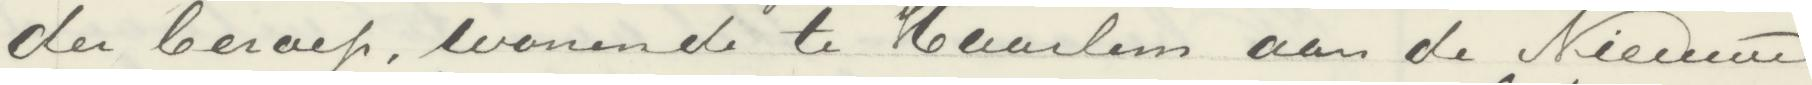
der beroep, wonende te Haarlem aan de Nieuwe
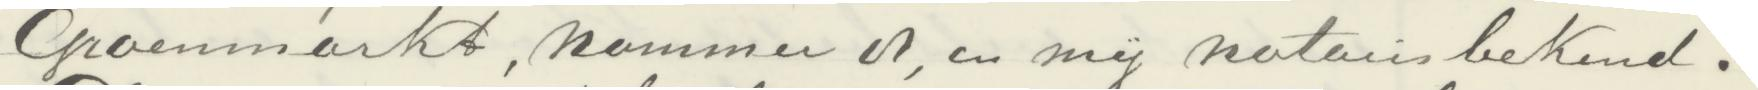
Groenmarkt, Nommer 8, en mij notaris bekend.
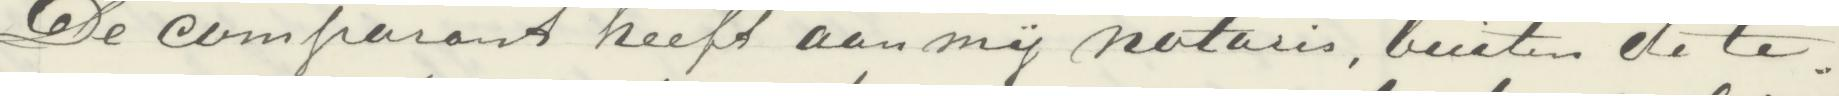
De comparant heeft aan mij notaris, buiten de te„
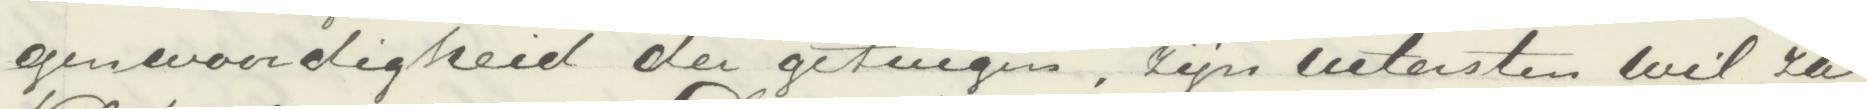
genwoordigheid der getuigen, zijn uitersten wil za
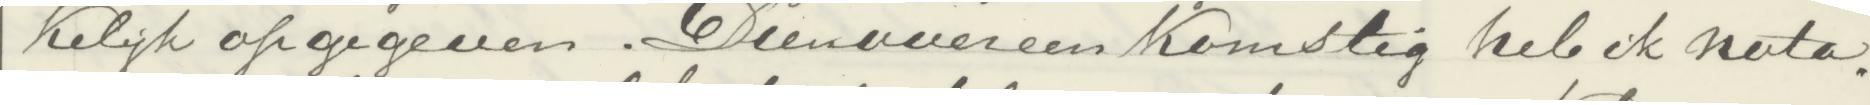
kelijk opgegeven. Dienovereenkomstig heb ik nota„
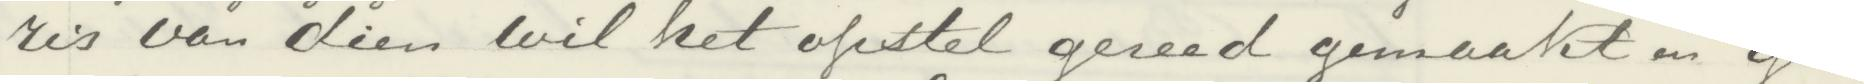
ris van dien wil het opstel gereed gemaakt en ge
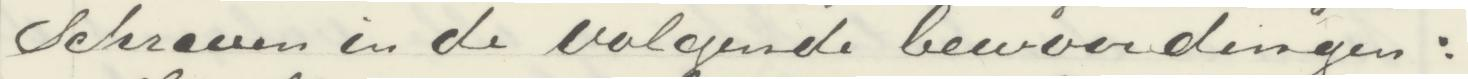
schreven in de volgende bewoordingen.
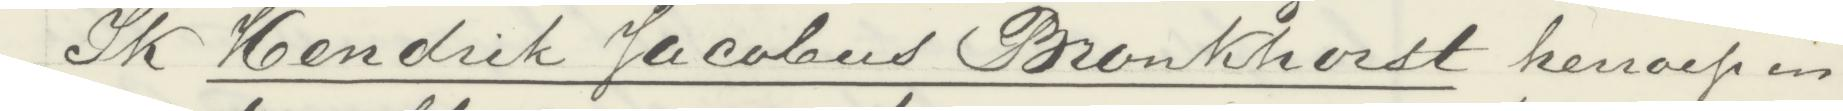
Ik Hendrik Jacobus Bronkhorst herroep en
